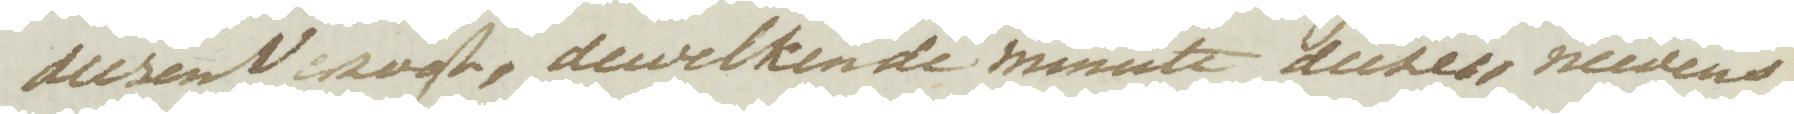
deezen Verzogt, dewelken de minute deezes, neevens
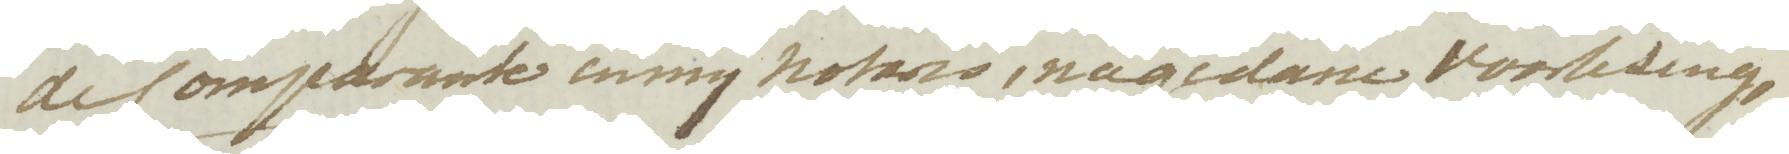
de Comparante en my Notaris, na gedane voorlezing,
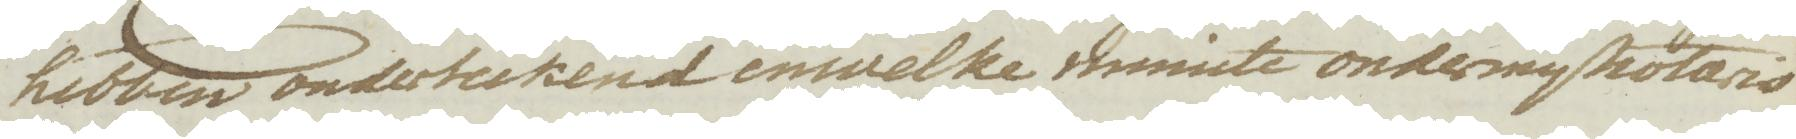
hebben onderteekend enwelke minute onder my Notaris
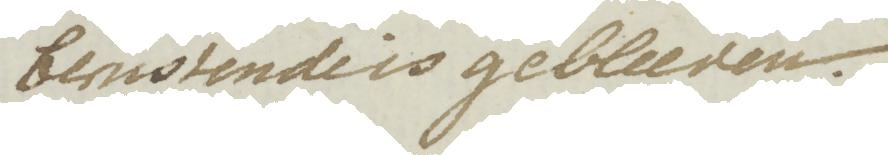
berustende is gebleeven.
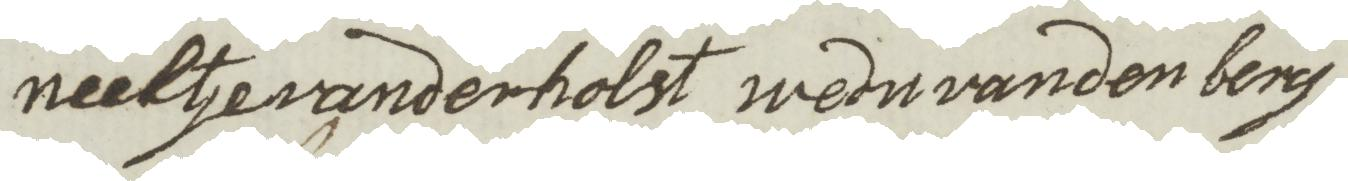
neeltje vanderholst wedu van den berg
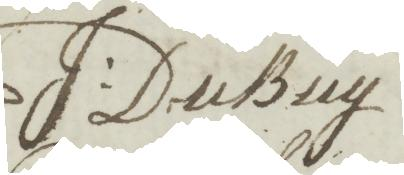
J: DuBuy
